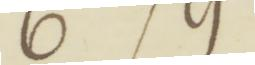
679
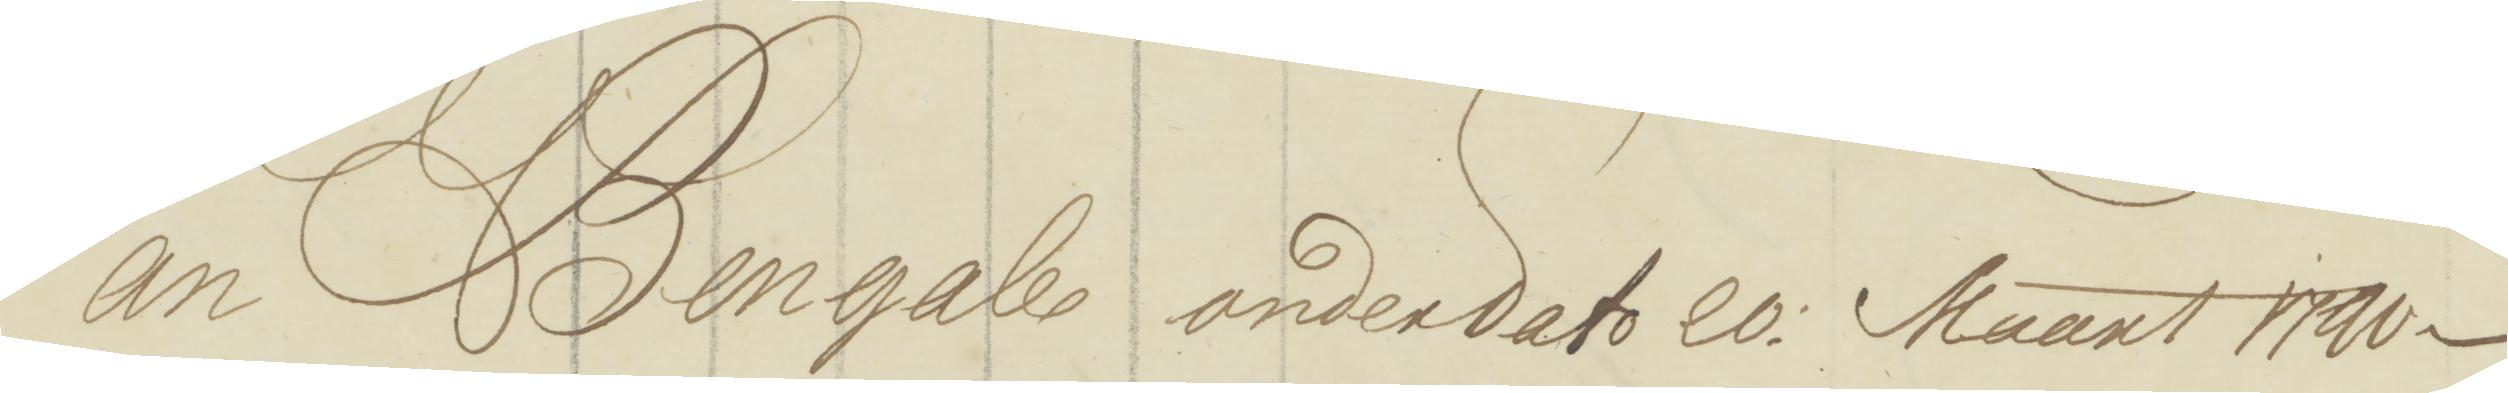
Van Bengale onder dato 20: Maart 1740
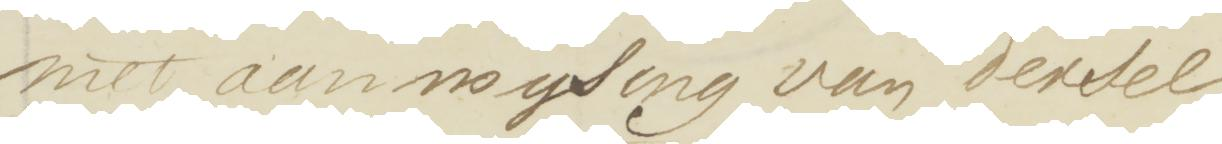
met aan wijsing van dersel
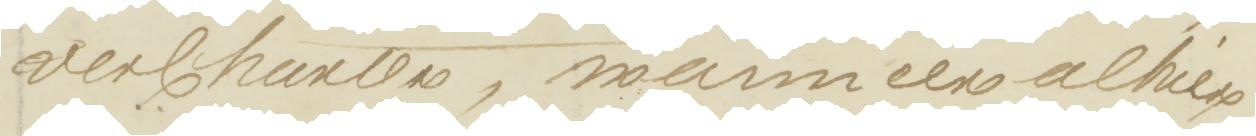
vercharter, wanneer alhier
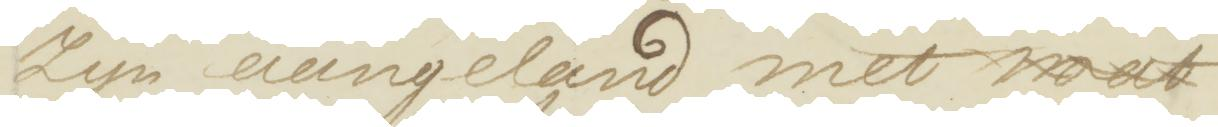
zijn aangeland met wat
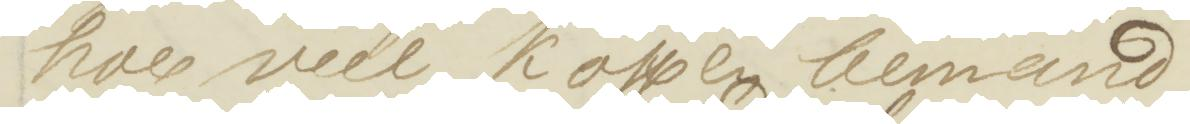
hoe veel koppen bemand
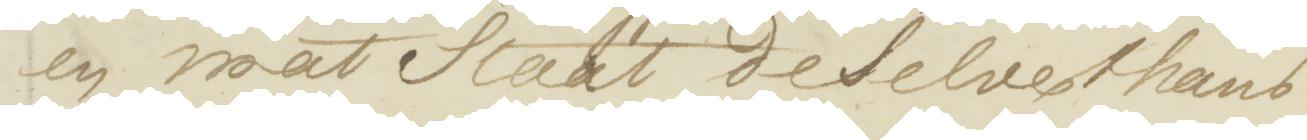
en wat staat deselve thans
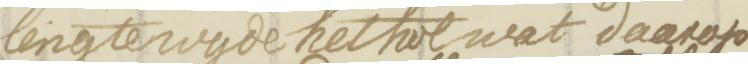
lengtewijde het hol wat daarop
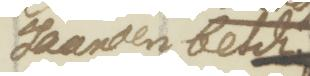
Jaar den„ besch.
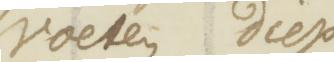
voeten diep
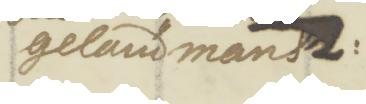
geland mansz
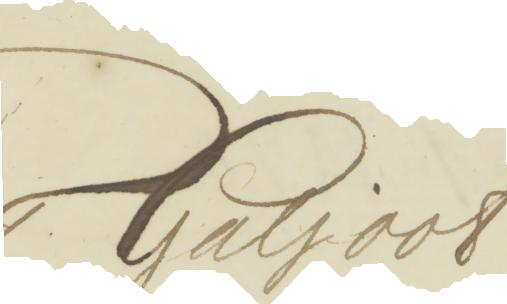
Galjoot
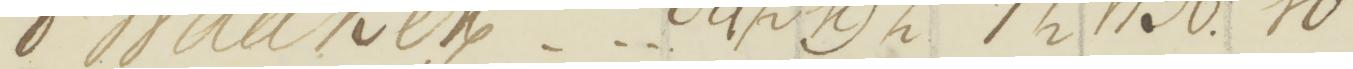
d'Waaker - - - 64½ 19½ 7½ 1730: 10
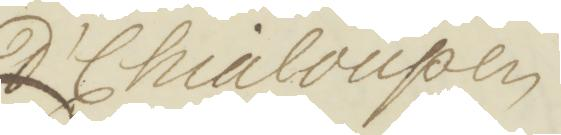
d’Chialoupen
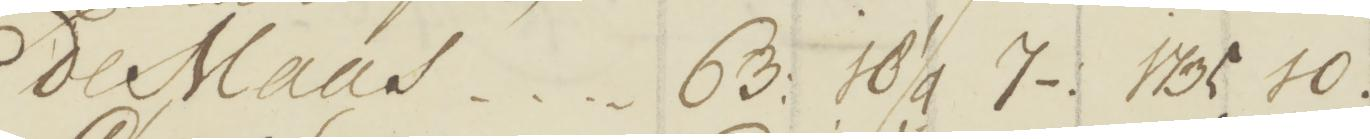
de Maas - - - - 63: 18¼ 7-: 1735 10
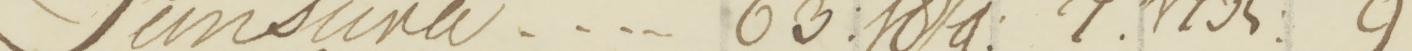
Sunsura - - - - 63: 18¼: 7. 1735: 9
